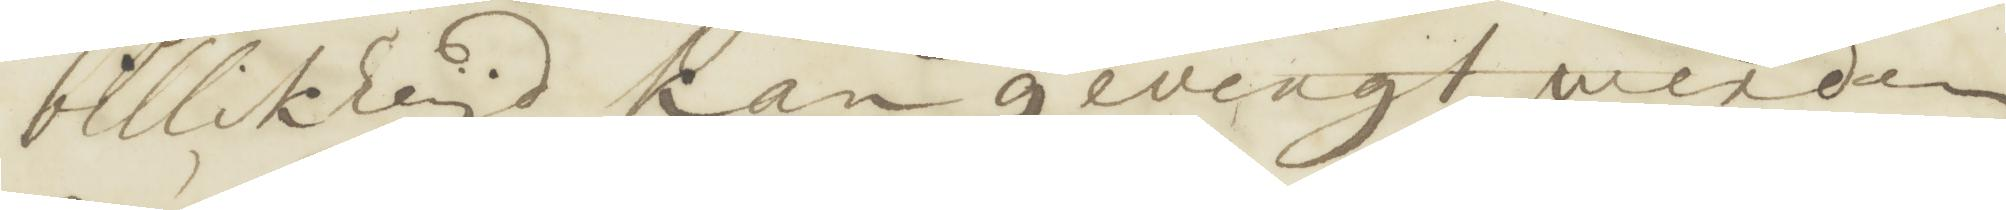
billikheijd kan gevergt werden
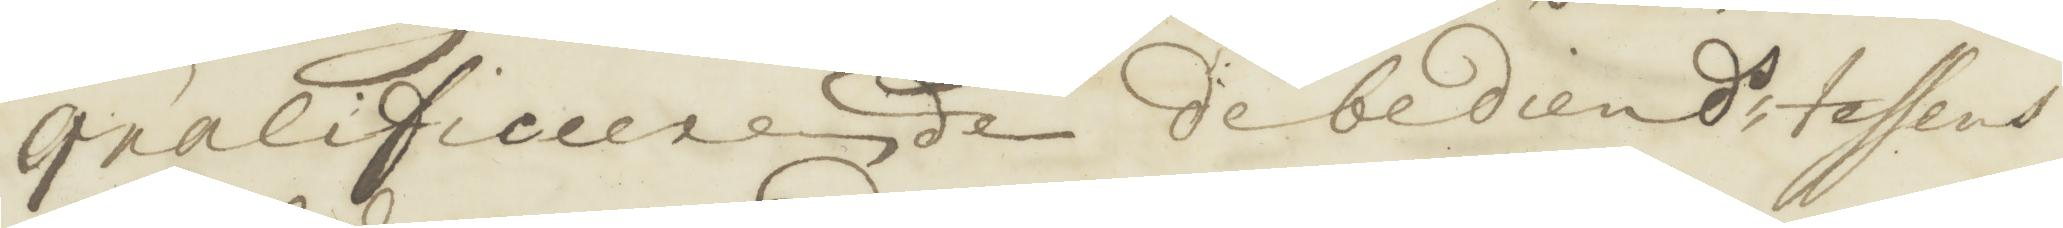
qualificeerende de bediend„s teffens
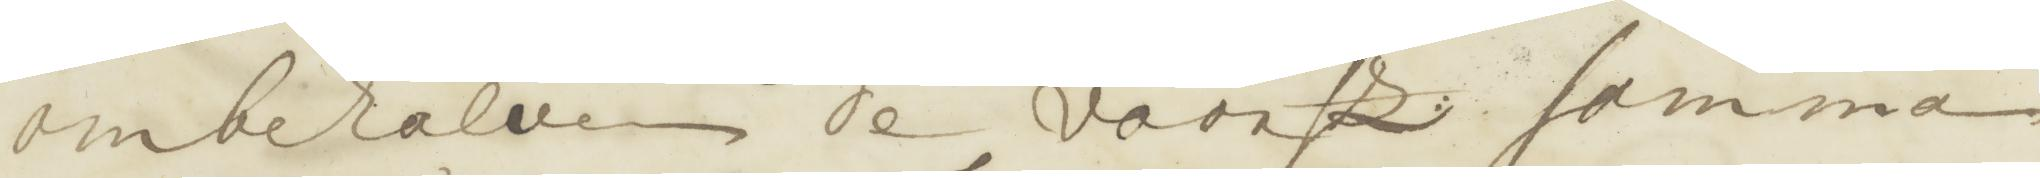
ombehalve de voorsz: somma
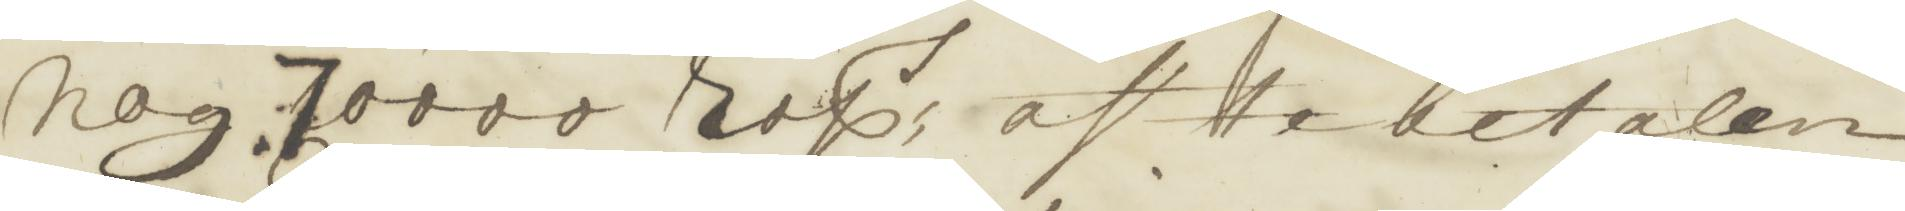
nog 70000 rop„s af te betalen
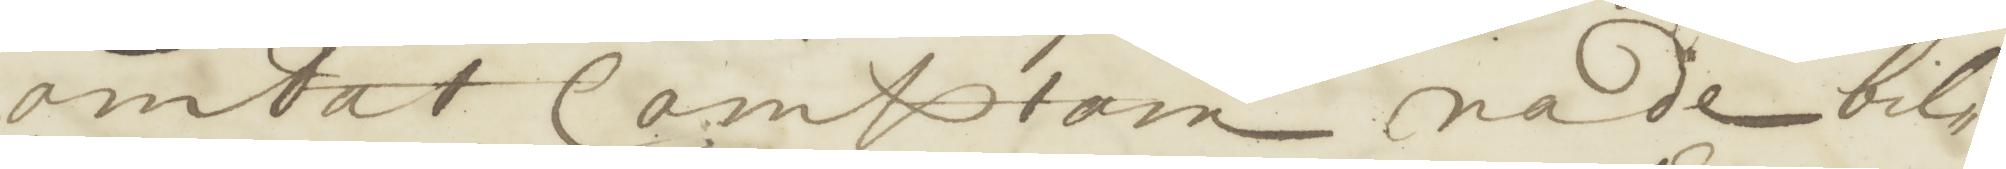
om dat Comptoir nade bil„
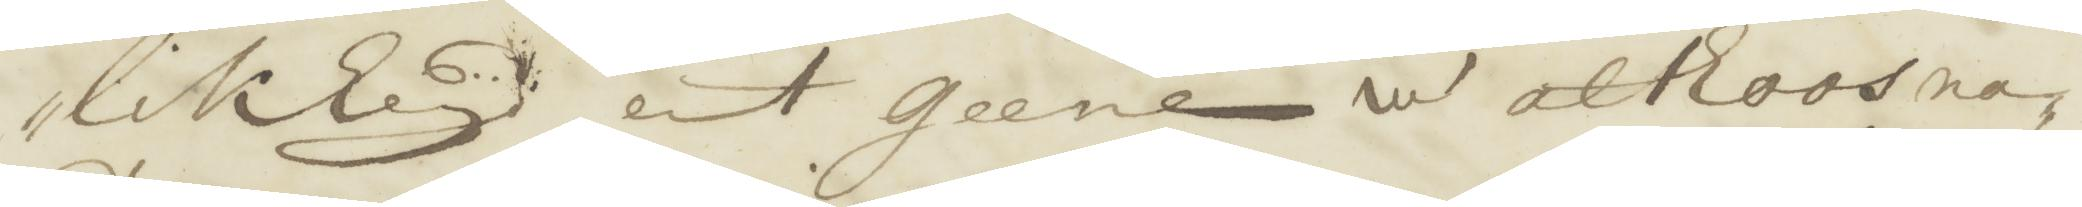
„likheijd en't geene w' althoos na„
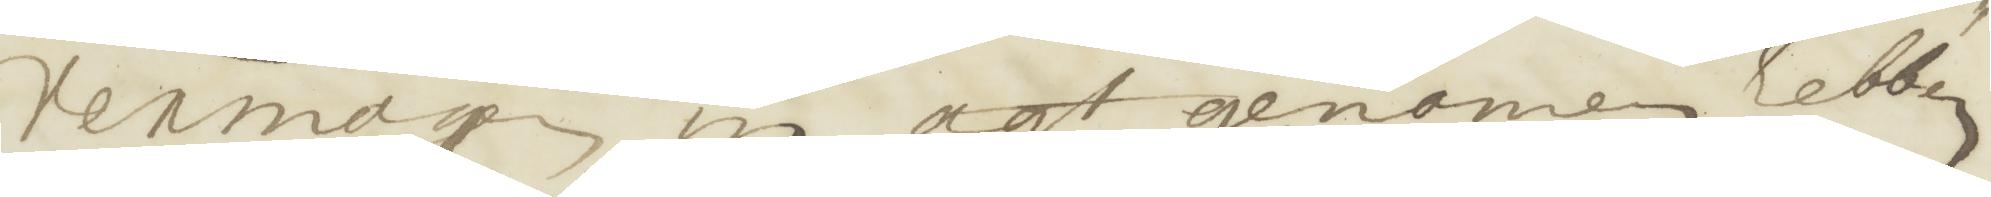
vermoge in agt genomen hebben
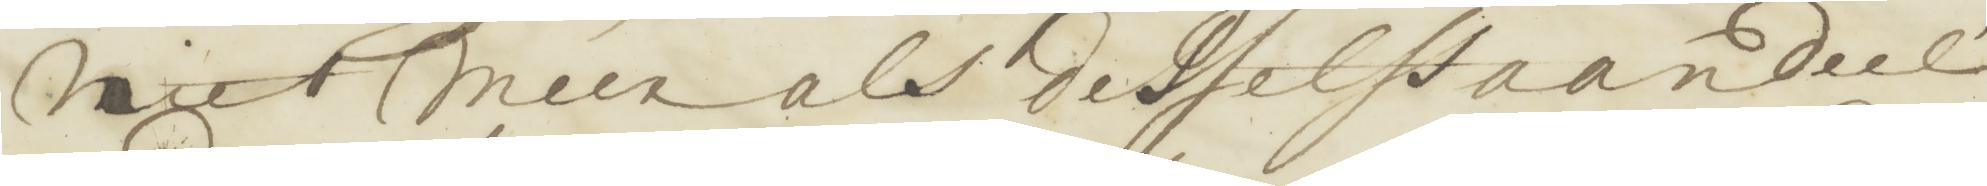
niet meer als desselfs aandeel
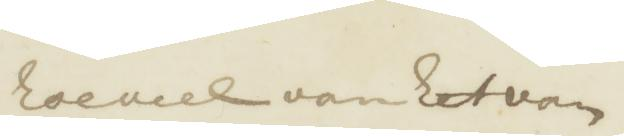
hoeveel van het van
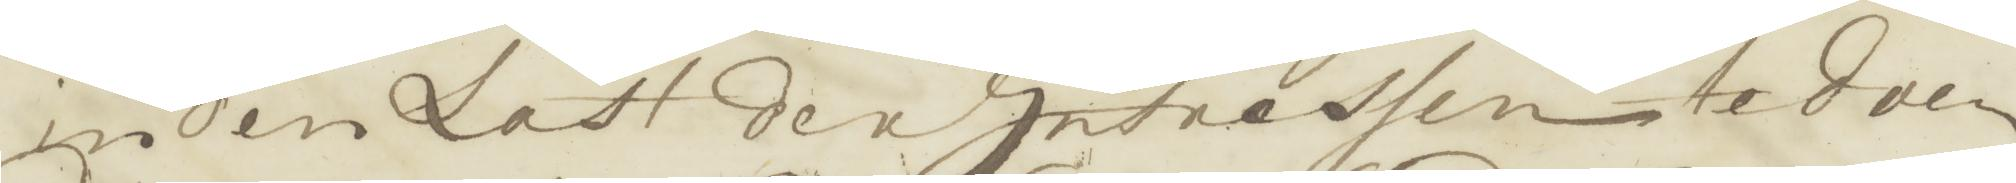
in den Last der Jntressen te doen
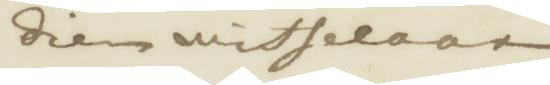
dien wisselaar
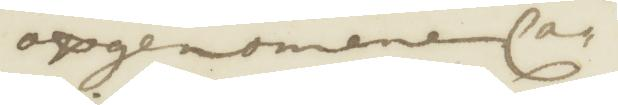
opgenomene Ca„
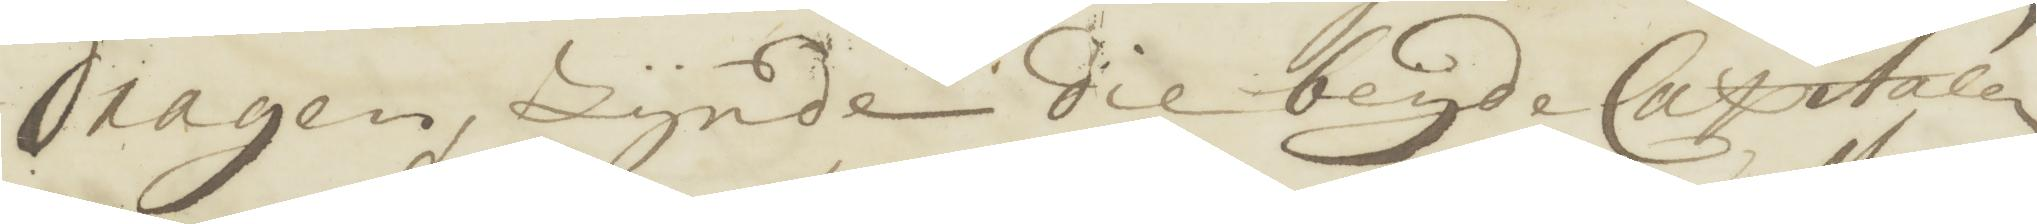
dragen, zijnde die beijde Capitalen
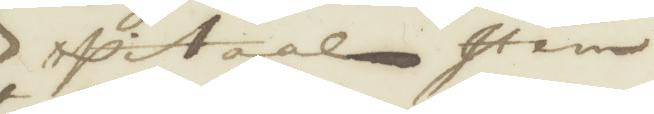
„pitaal jtem
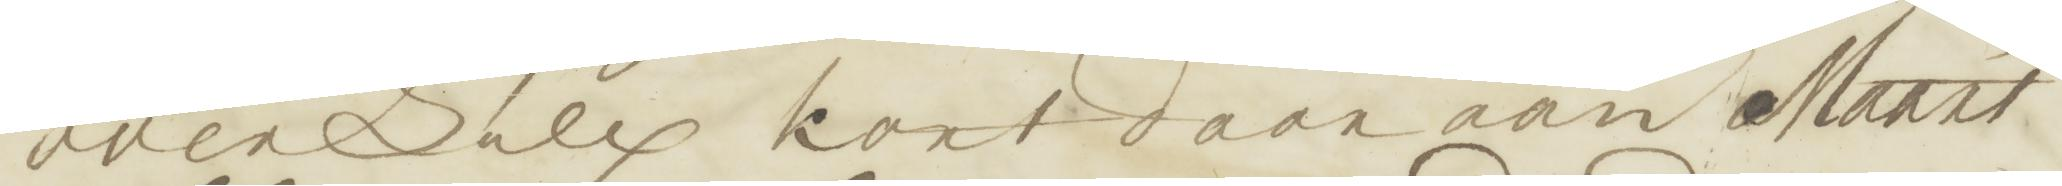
over zulx kort daar aan Maart
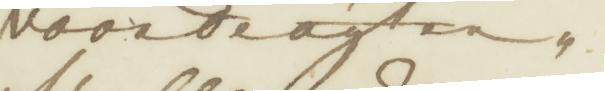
voor de agter„
